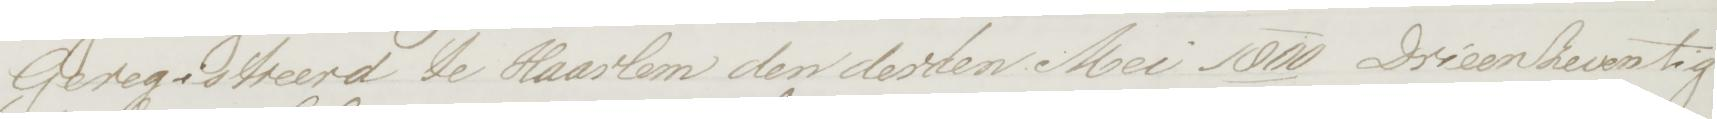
Geregistreerd te Haarlem den derden Mei 1800 Drie en Zeventig
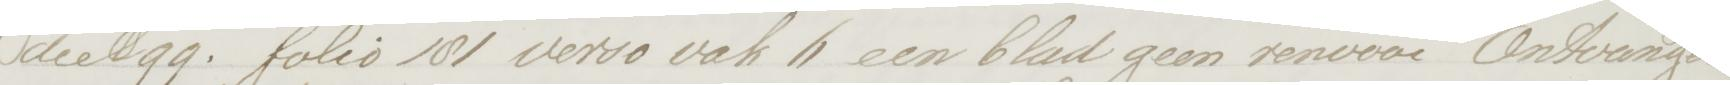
deel qq. folio 181 verso vak 6 een blad geen renvooi Ontvangen
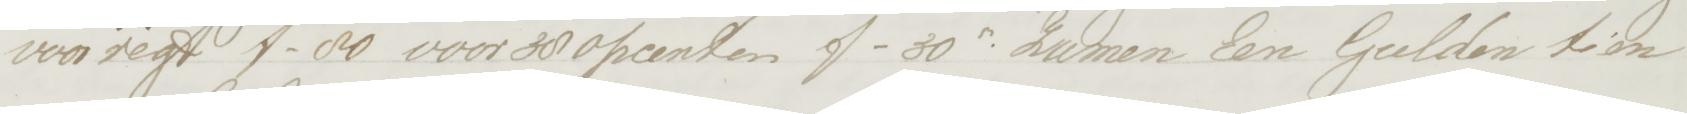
voor regt ƒ. 80 voor 38 opcenten ƒ- 30:' Zamen Een Gulden tien
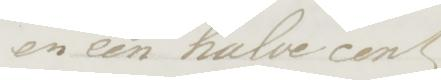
en een halve cent
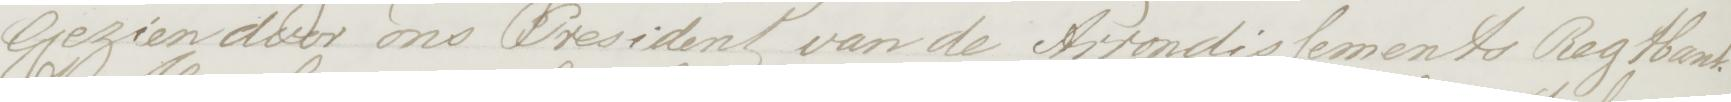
Gezien door ons President van de Arrondissements Regtbank
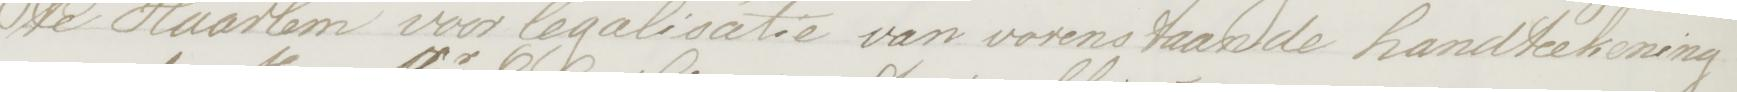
te Haarlem voor legalisatie van vorenstaan de handteekening
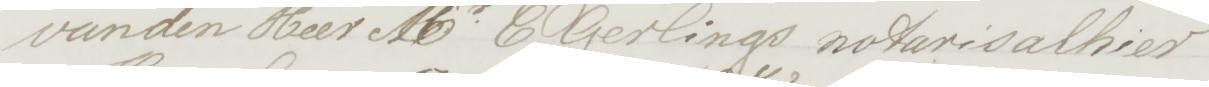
van den Heer M:r C Gerlings notaris alhier
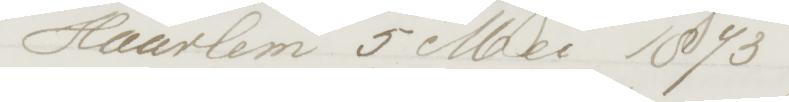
Haarlem 5 Mei 1873
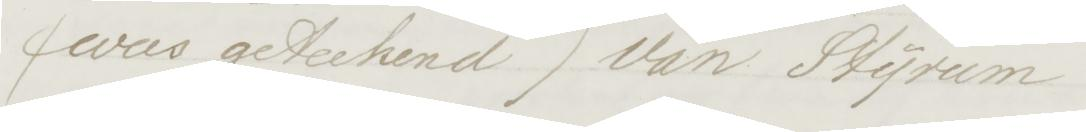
/was geteekend/ van Stijrum
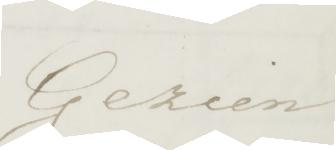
Gezien
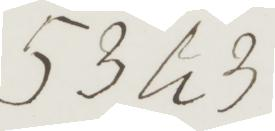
5343
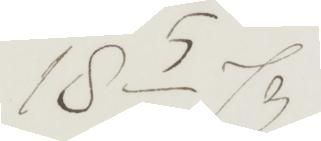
18 5/3 73
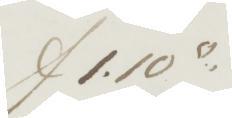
ƒ1.10:'
